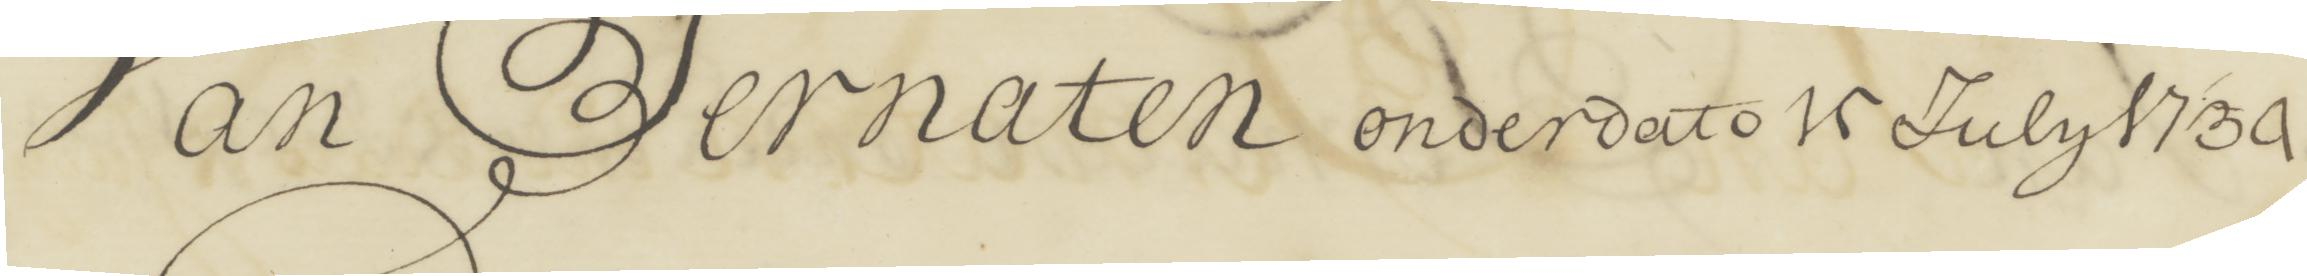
Van Ternaten onder dato 15 Iuly 1734
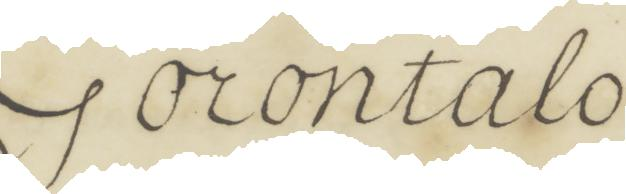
Gorontalo
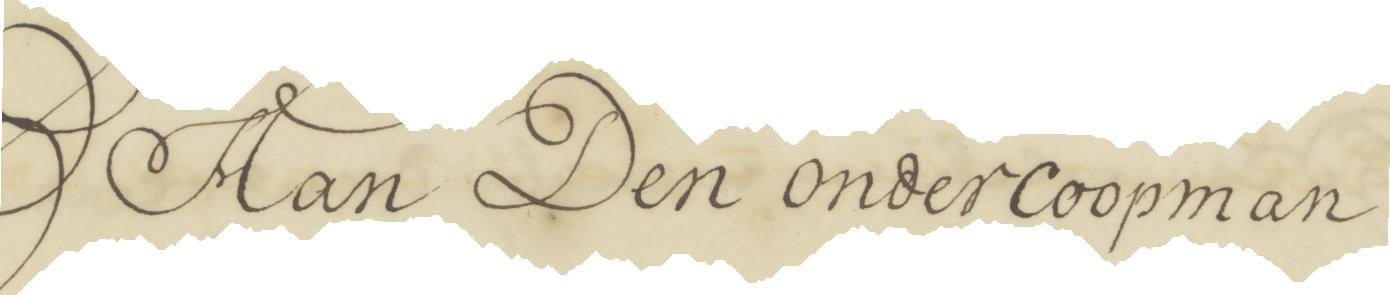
Aan Den onder coopman
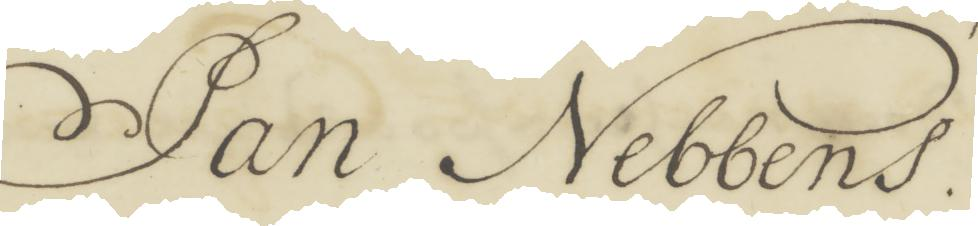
Jan Nebbens.
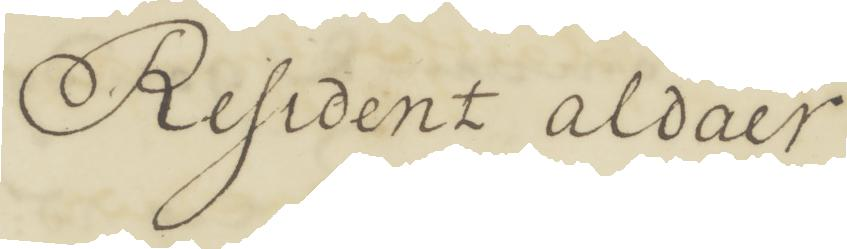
Resident aldaer
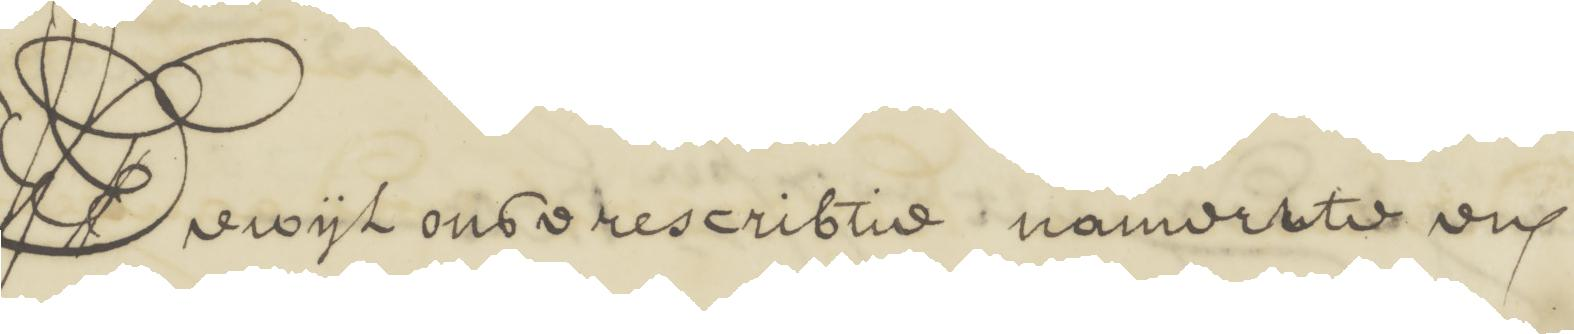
Dewijl onse rescribtie namerte en
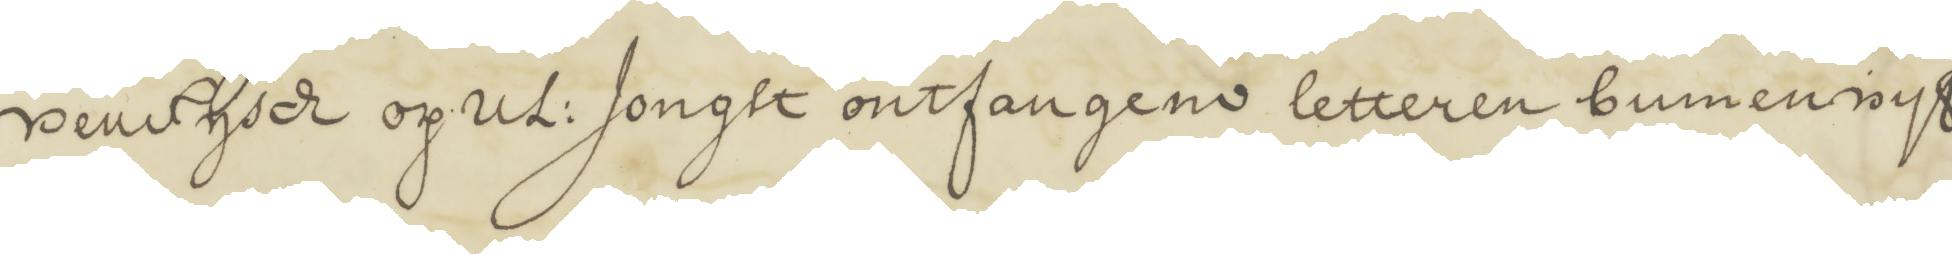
verEysch op uL: Jongst ontfangene letteren binnen vy
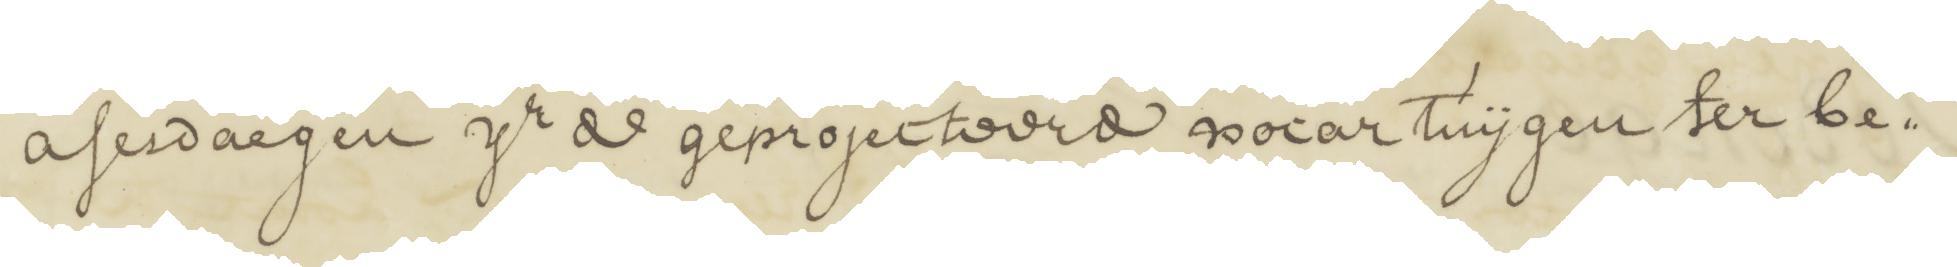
a ses daegen pr de geprojecteerd vocar tuijgen ter be„
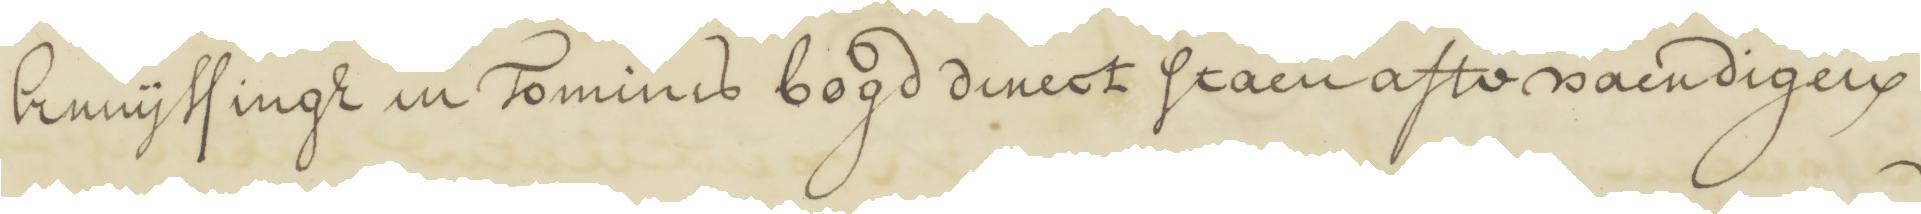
kruijssingh in Tominis bogd direct staen afte vaerdigen
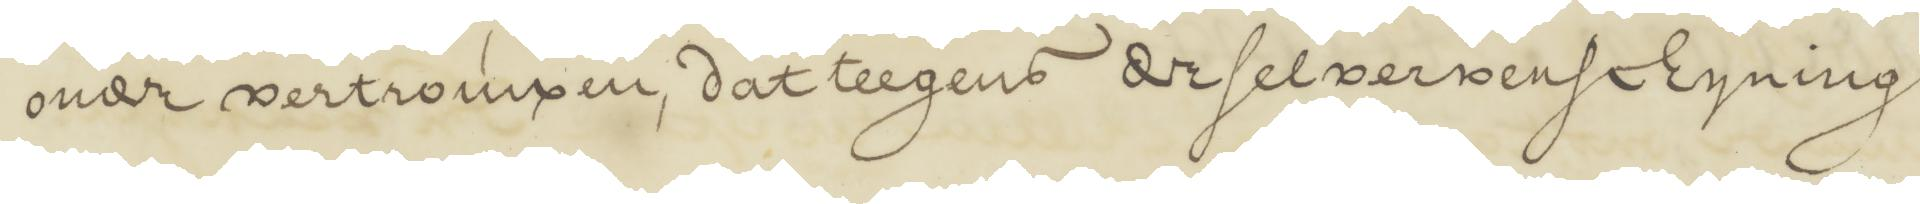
onder vertrouwen, dat teegens derselver verschyning
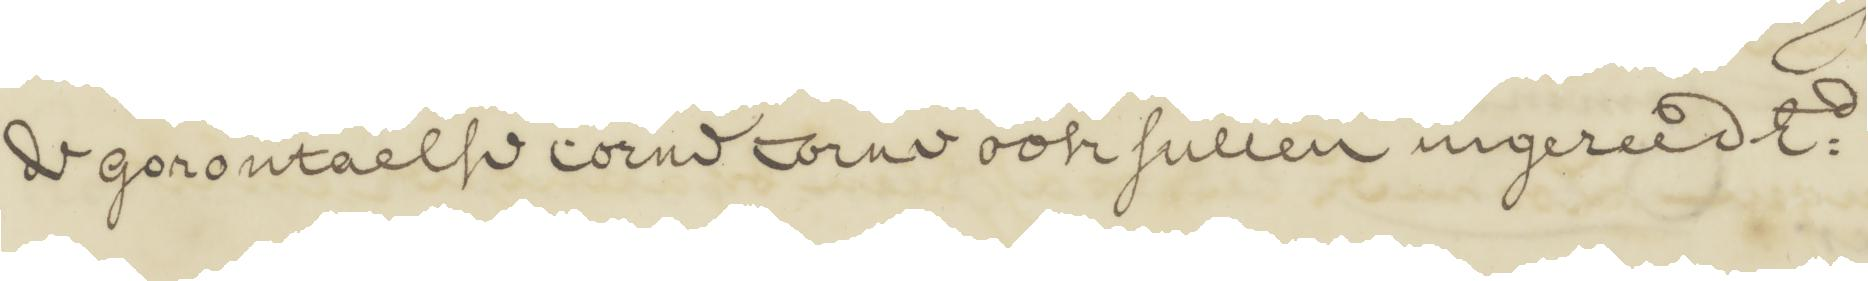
de gorontaelse corne corne ook sullen ingereedh:d
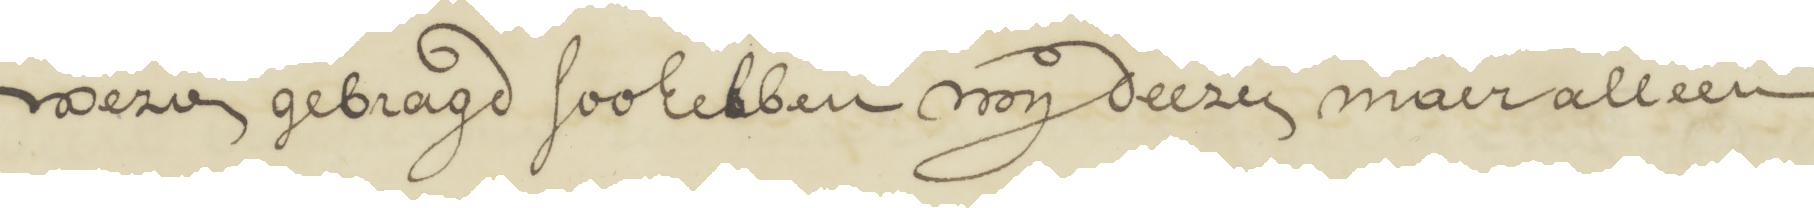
wezen gebragd soo hebben wy deezen maer alleen
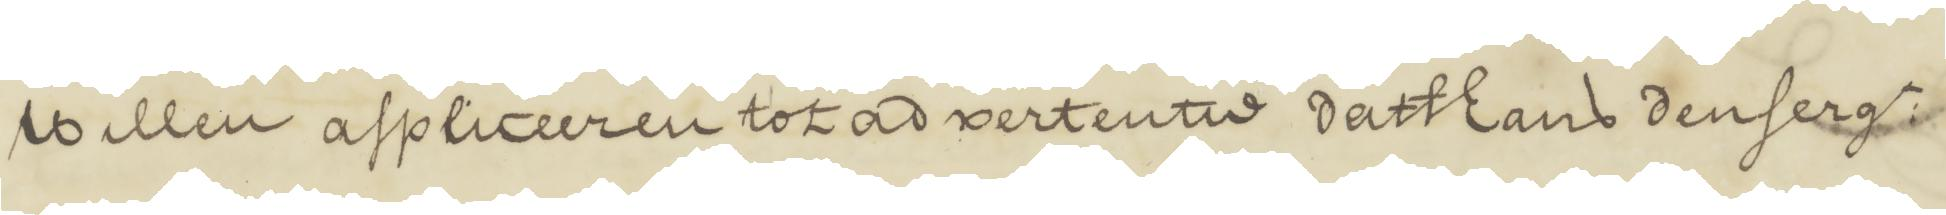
willen appliceeren tot advertentie dat thans den serg:t
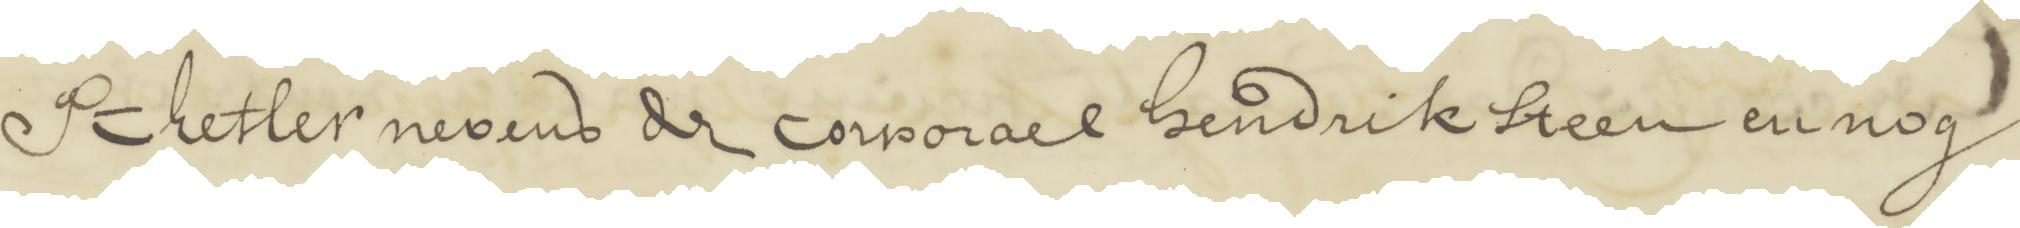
Schetler nevens den corporael hendrik steen en nog
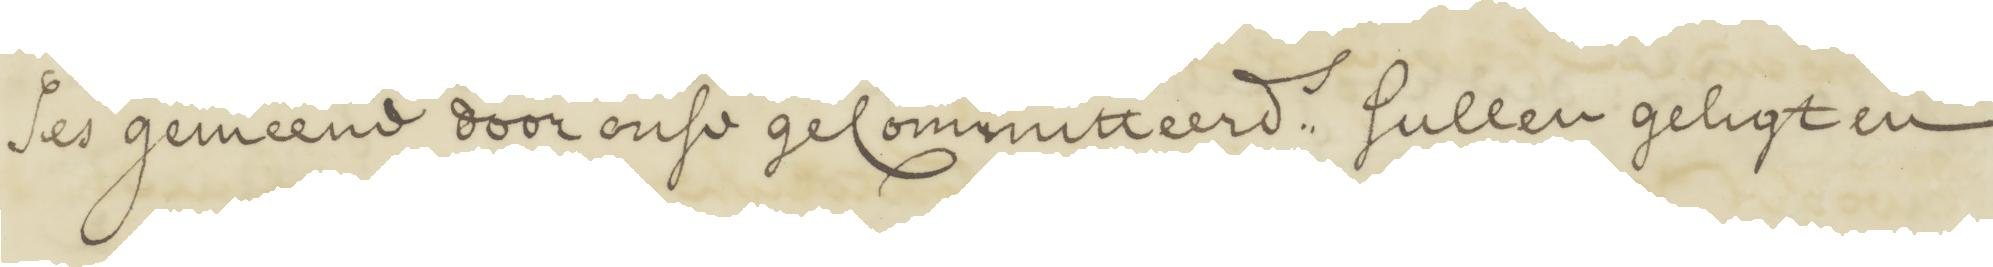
ses gemeene door onse gecommitteerd„s sullen geligt en
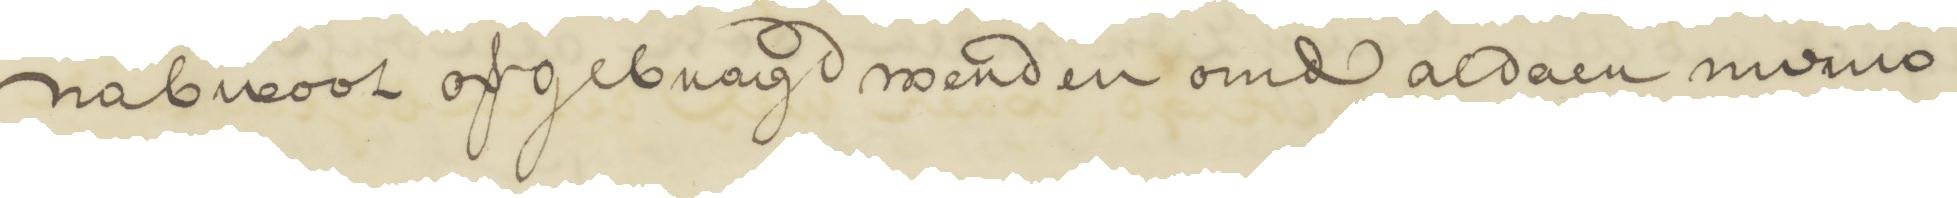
nabwool overgebragd werden om de aldaer nieuw
